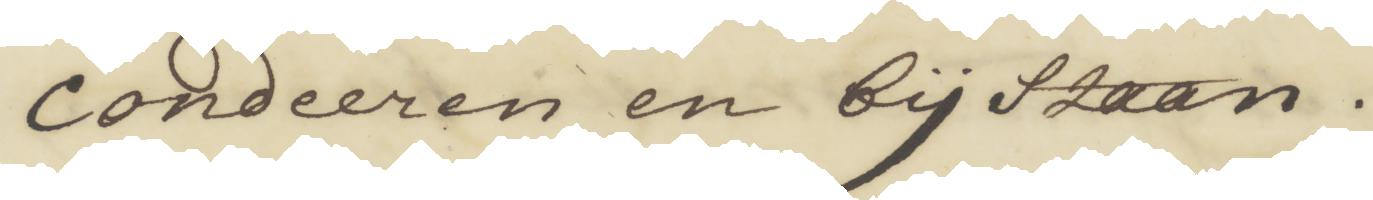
condeeren en bij staan.
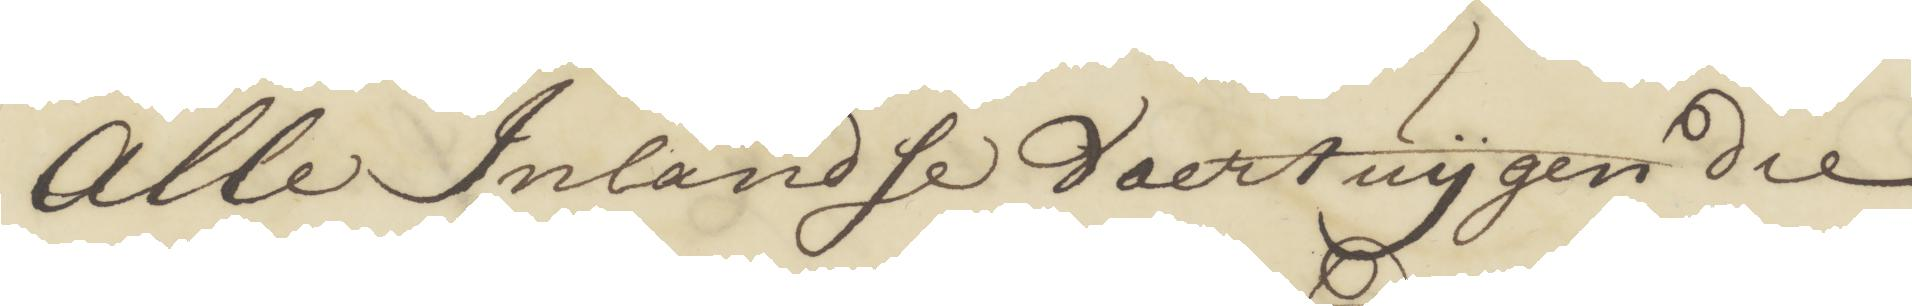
Alle Inlandse vaertuijgen die
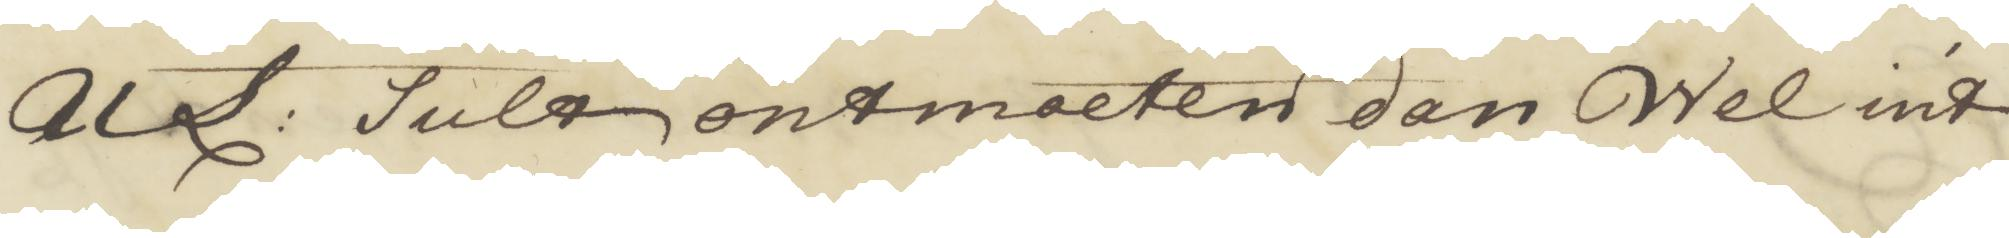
U E: sult ontmoeten dan wel in't
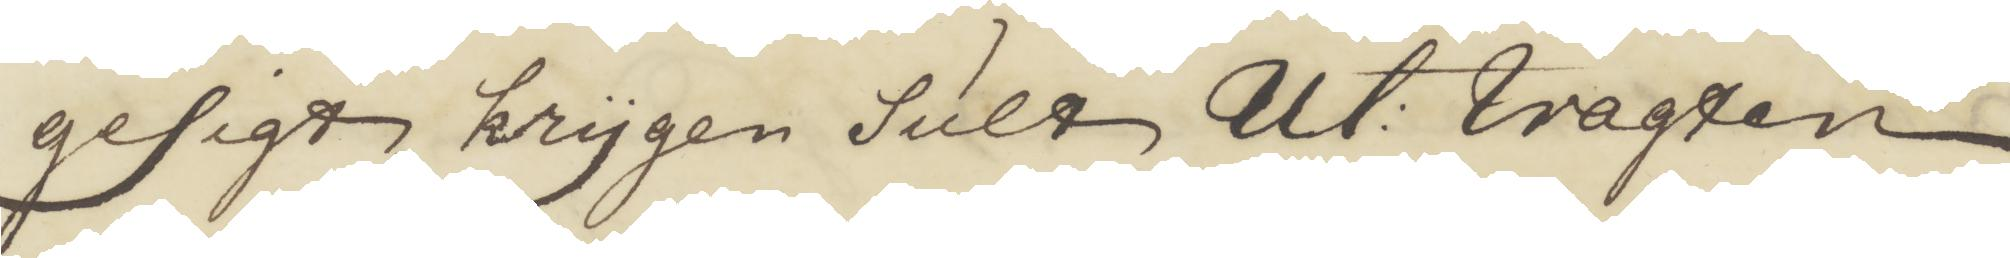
gesigt krijgen sult Ul: tragten
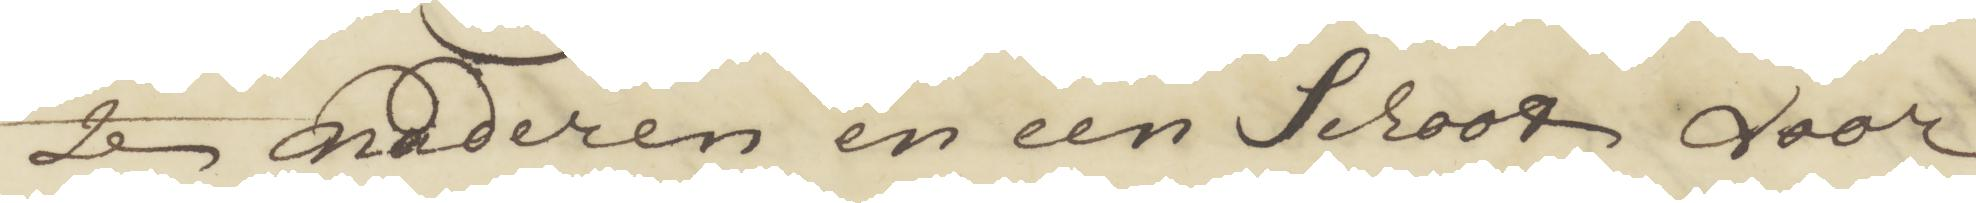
te naderen en een schoot voor
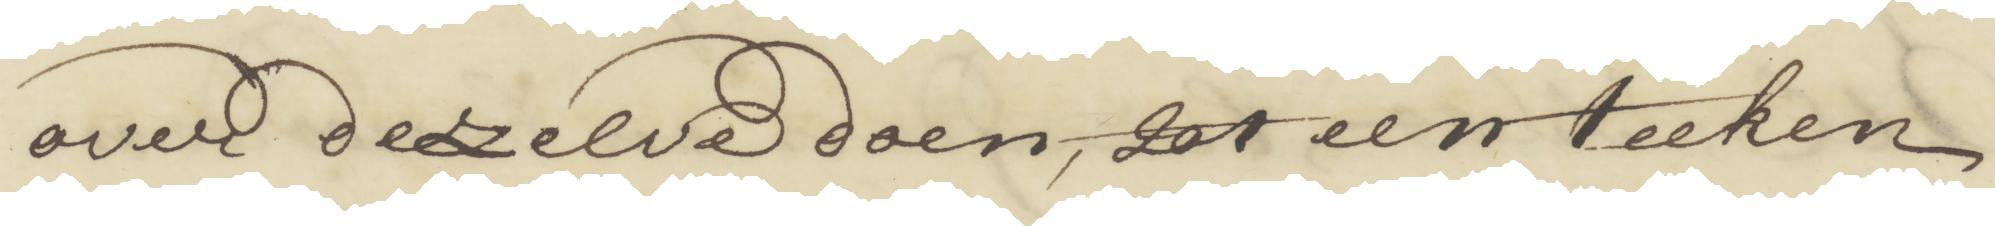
over dezelve doen, tot een teeken
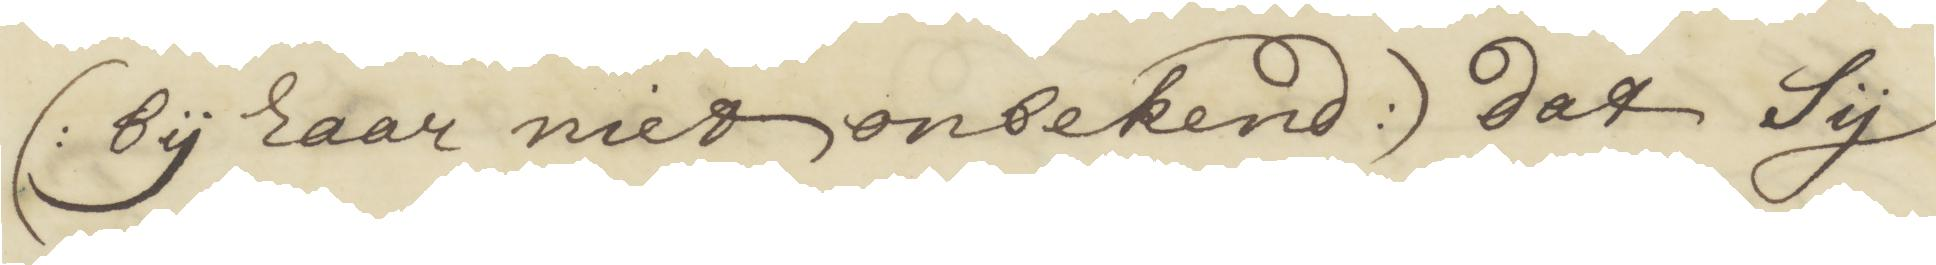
(:bij haar niet onbekend:) dat sij
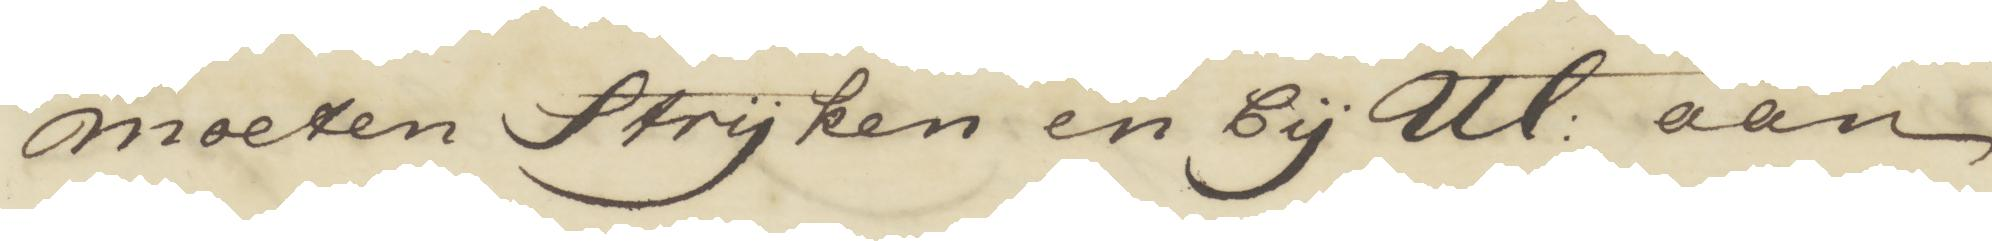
moeten strijken en bij Ul: aan
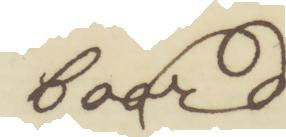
boord
